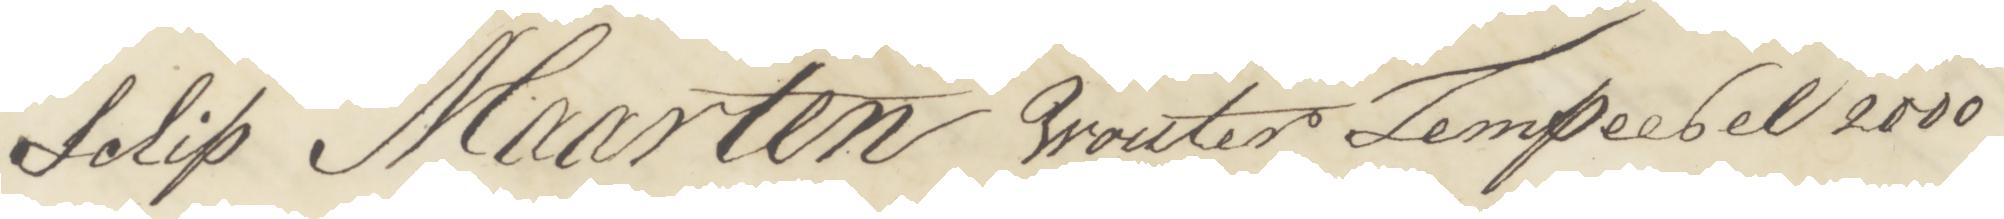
schip Maarten Wouter Tempeesel 2000
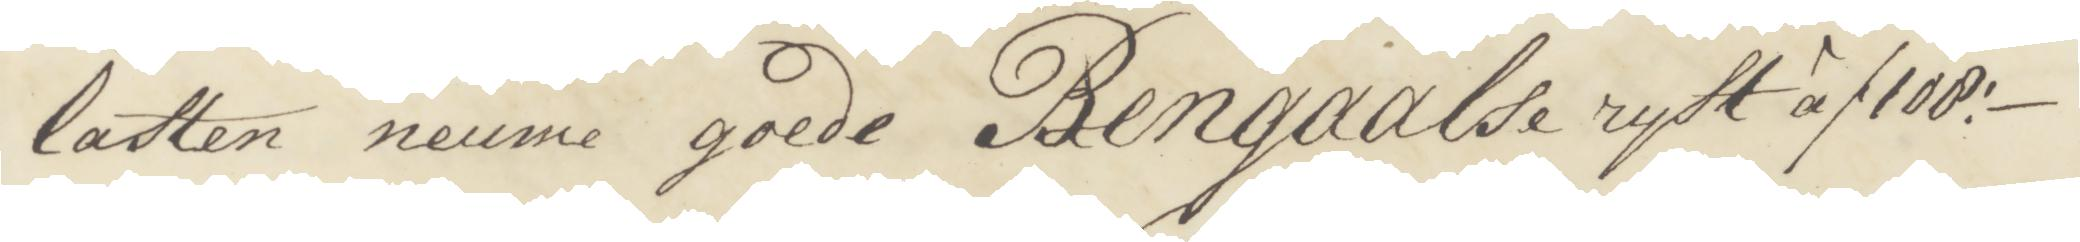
lasten neuwe goede Bengaalse ryst â ƒ 108:—
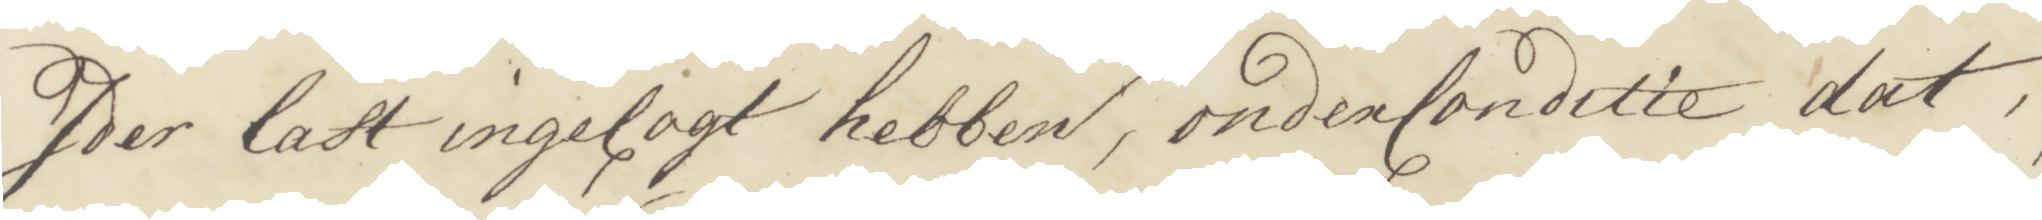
Jder last ingecogt hebben, onder conditie dat,
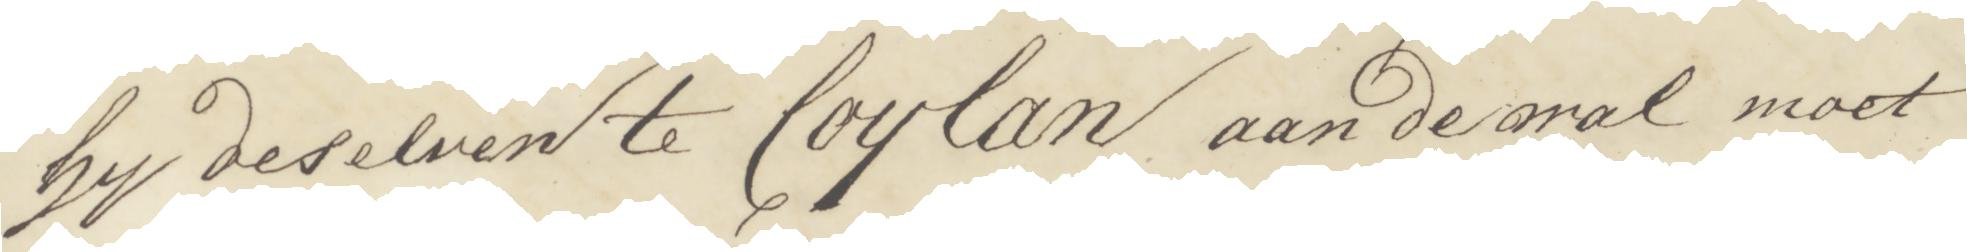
hy deselven te Coylan aan de wal moet
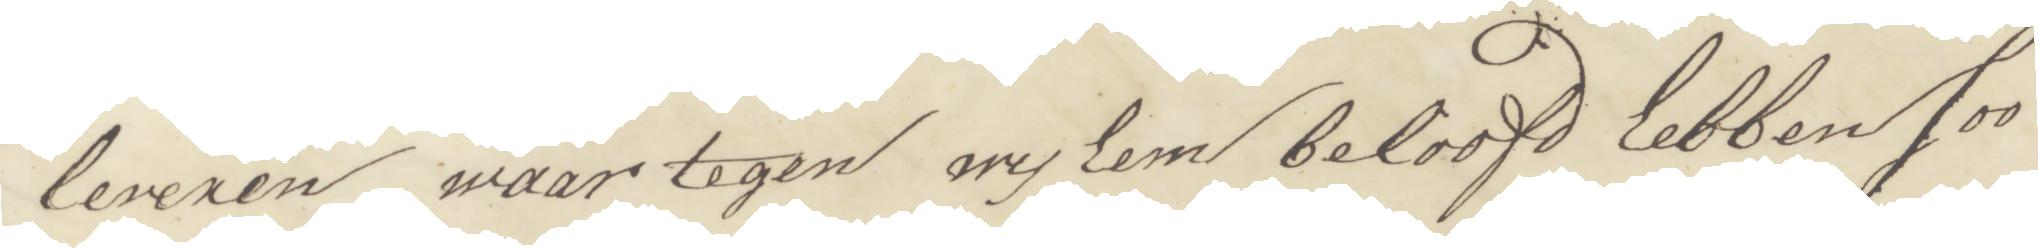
leveren waar tegen wij hem beloofd hebben soo
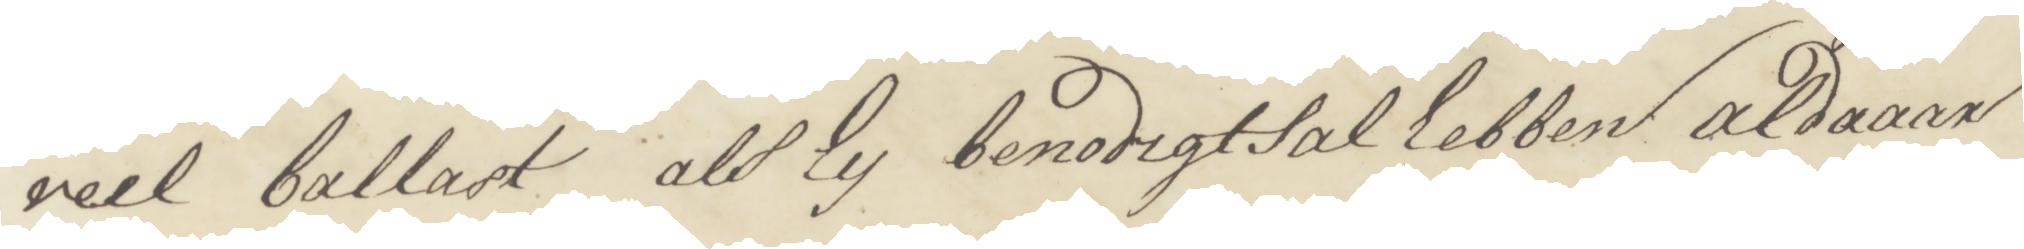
veel ballast als hy benodigt sal hebben aldaaar
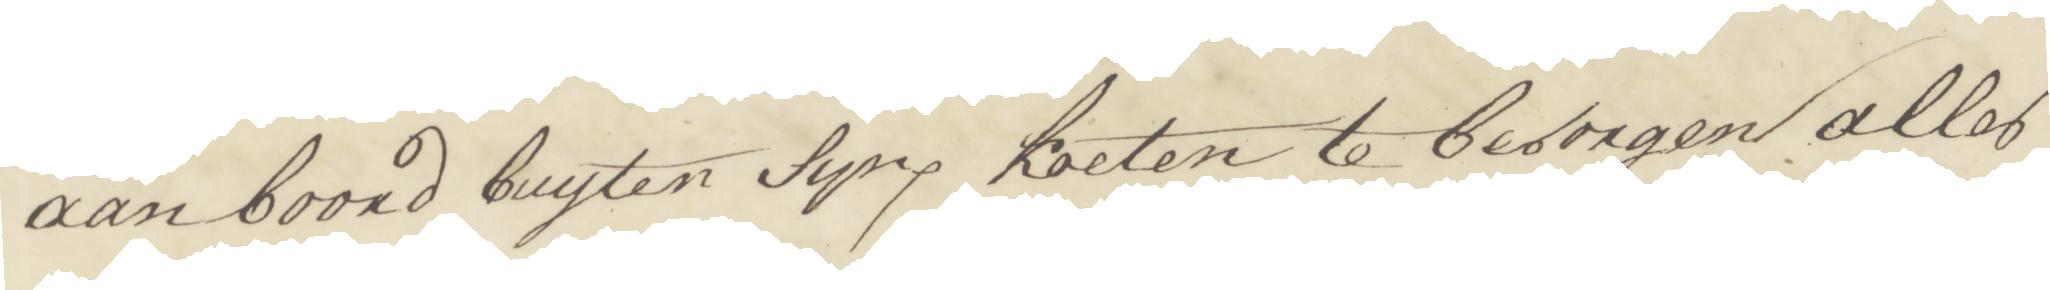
aan boord buyten syn koeten te besorgen alles
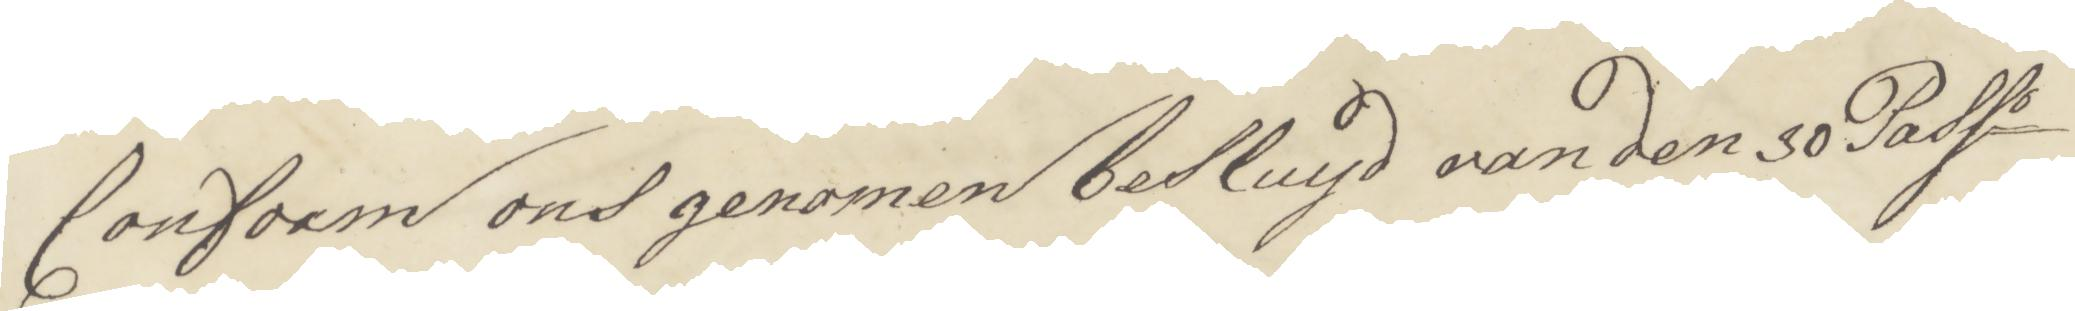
Conform ons genomen besluyd van den 30 Pass=o
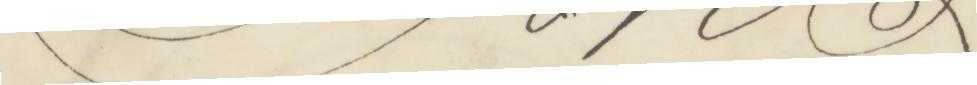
Jen
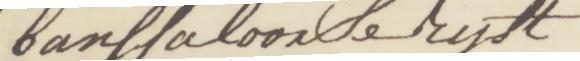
banssaloorse ryst
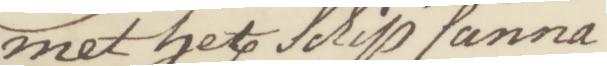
met het schip Canna
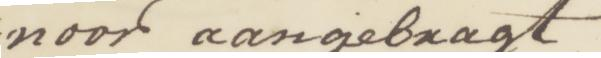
noor aangebragt
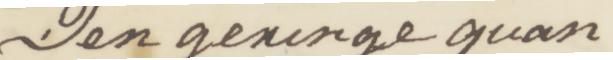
Een geringe quan
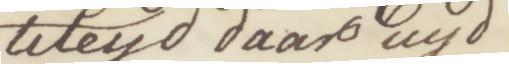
titeyd daar uyd
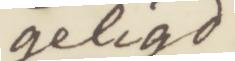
geligd
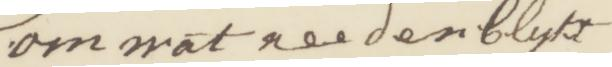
om wat reeden blykt
